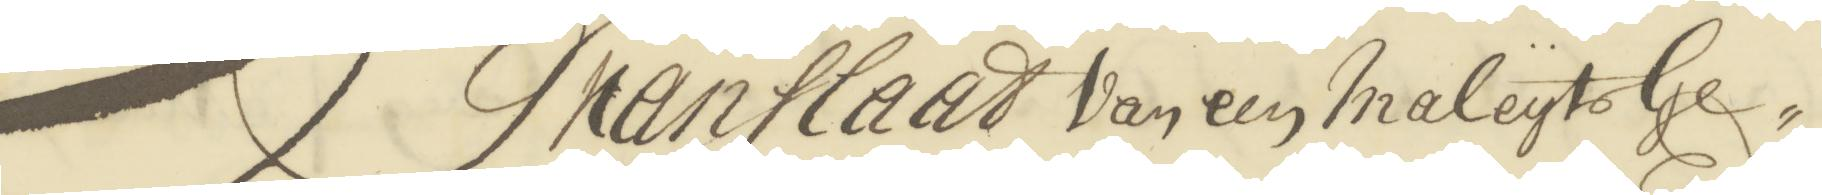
Translaat van een maleijts Ge„
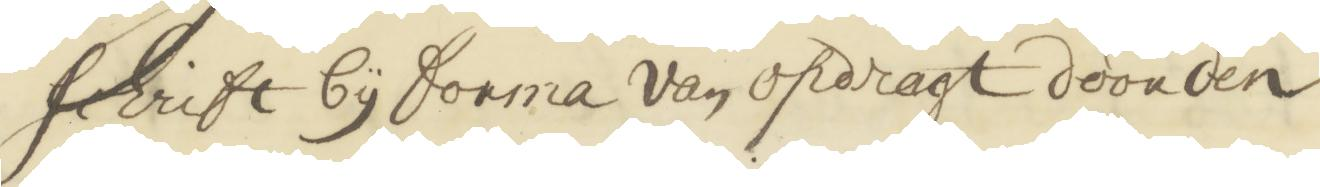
schrift bij forma van opdragt door den
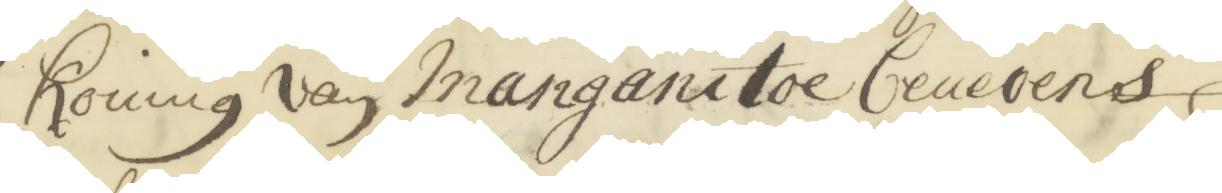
koning van Manganitoe benevens
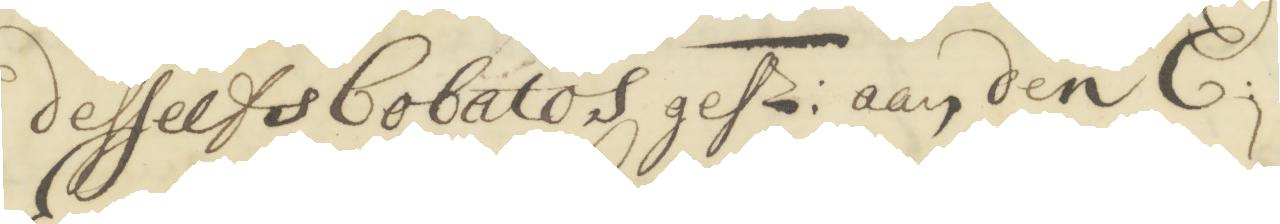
desselfs bobatos gesz: aan den E;
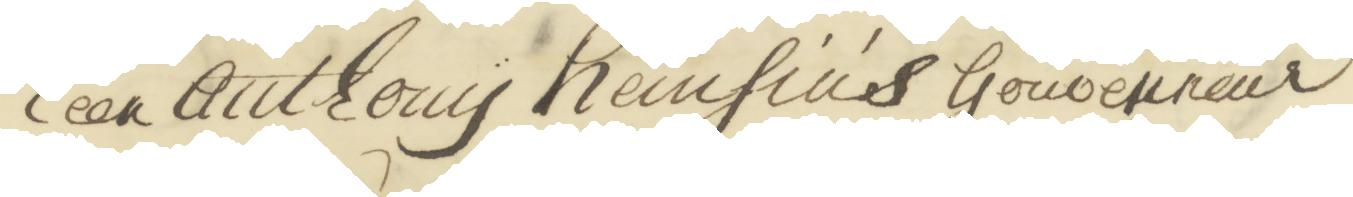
heer Anthonij Heinsius Gouverneur
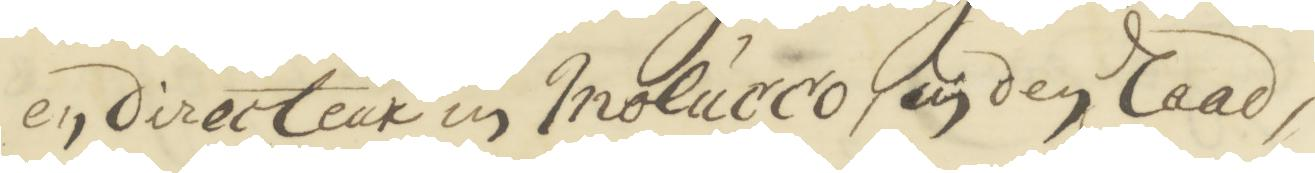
en directeur in Molucco / en den Raad,
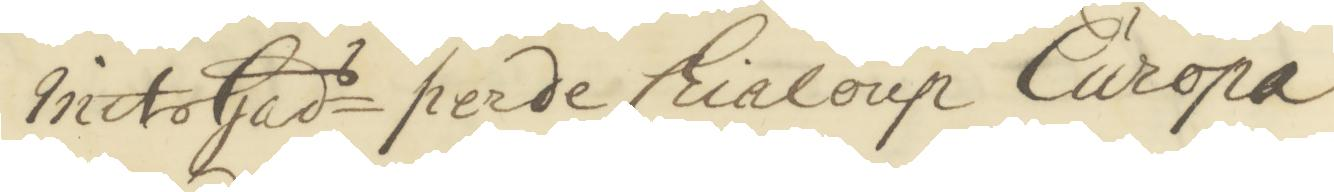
mitsgad=s per de Chialoup Europa
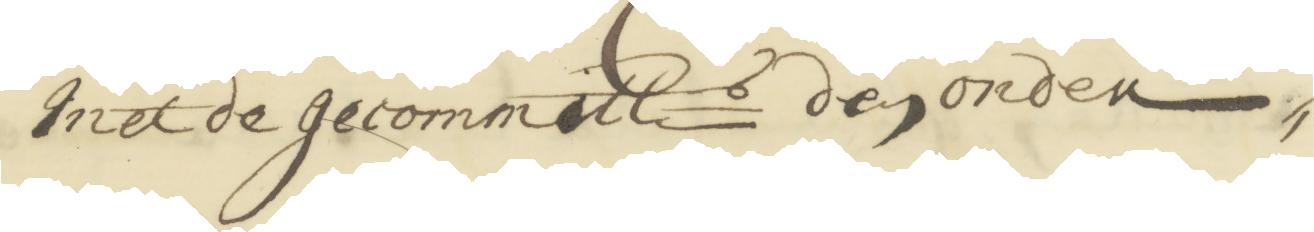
met de gecommitt=s den onder„
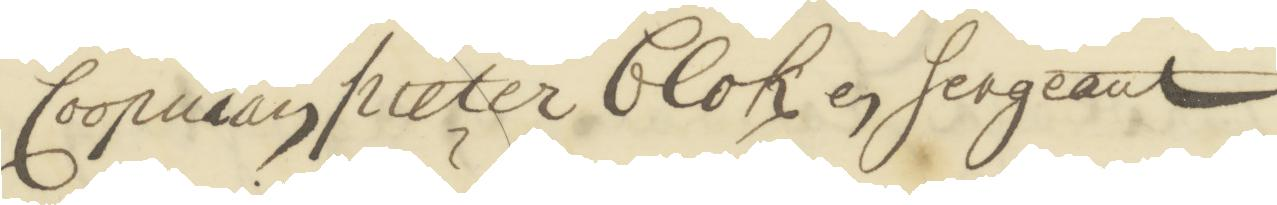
Coopman Pieter blok en Sergeant
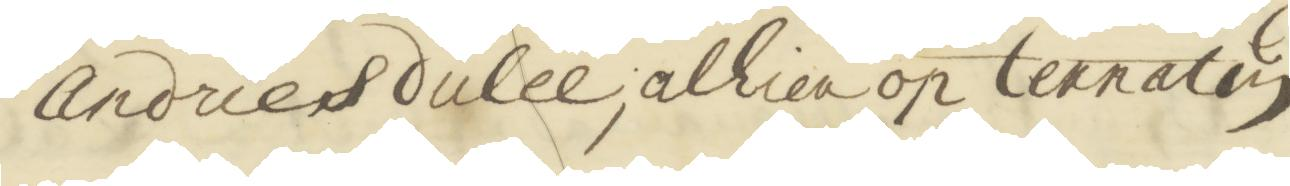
Andries dulee, alhier op ternaten
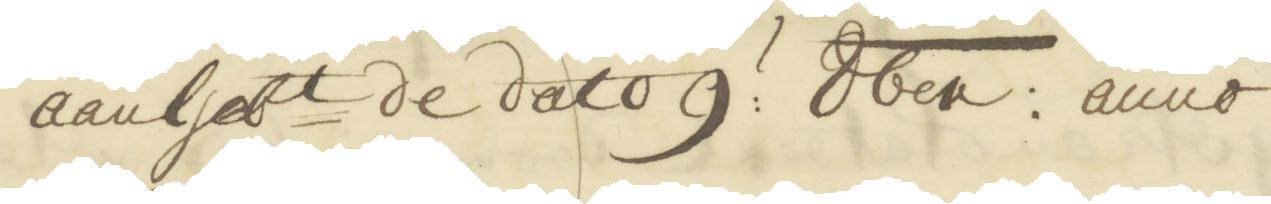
aan Geb=t de dato 9:' 8ber: anno
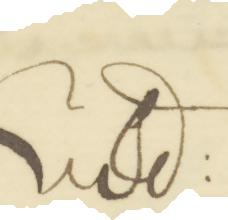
uEd:
